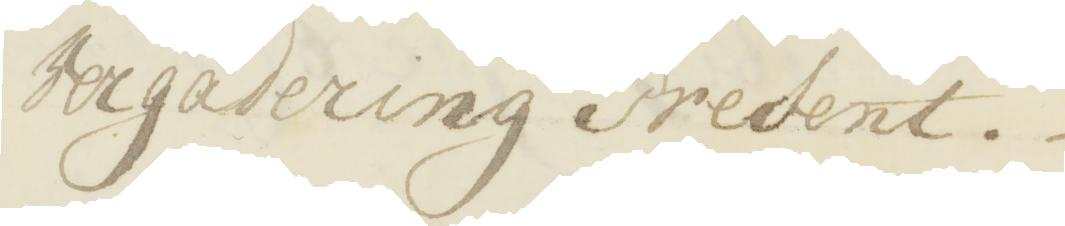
vergadering Present.
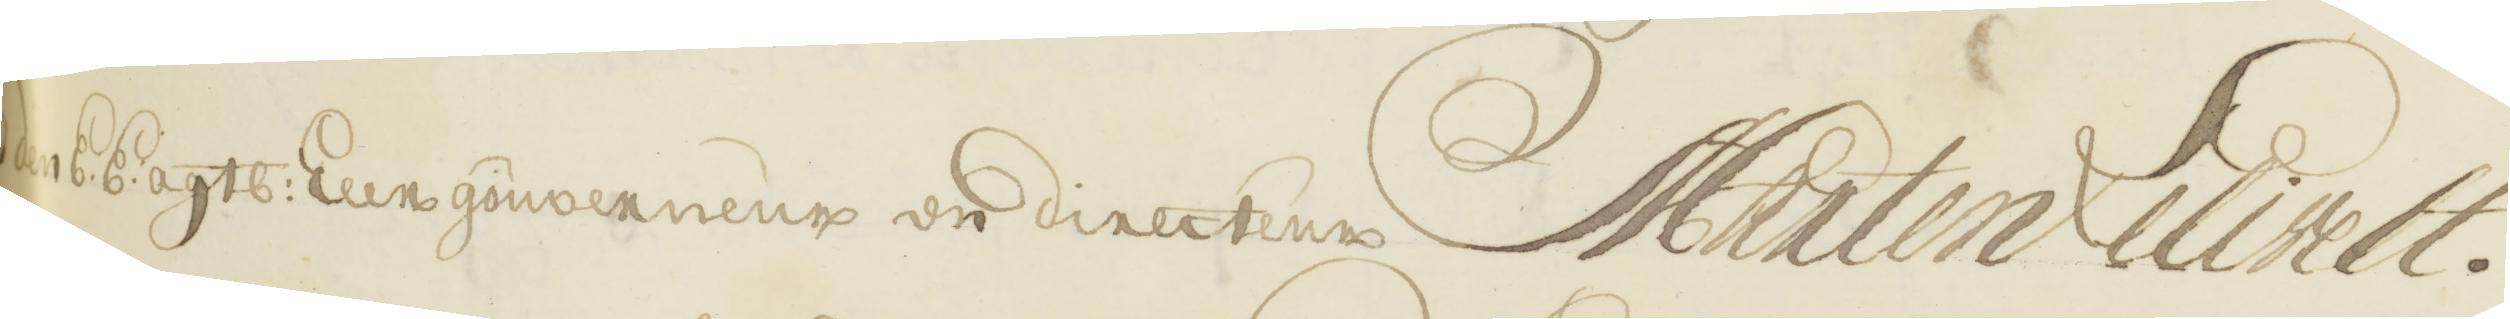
den E:E: agtb: Eeen gouverneur en directeur Marten Lelivelt,
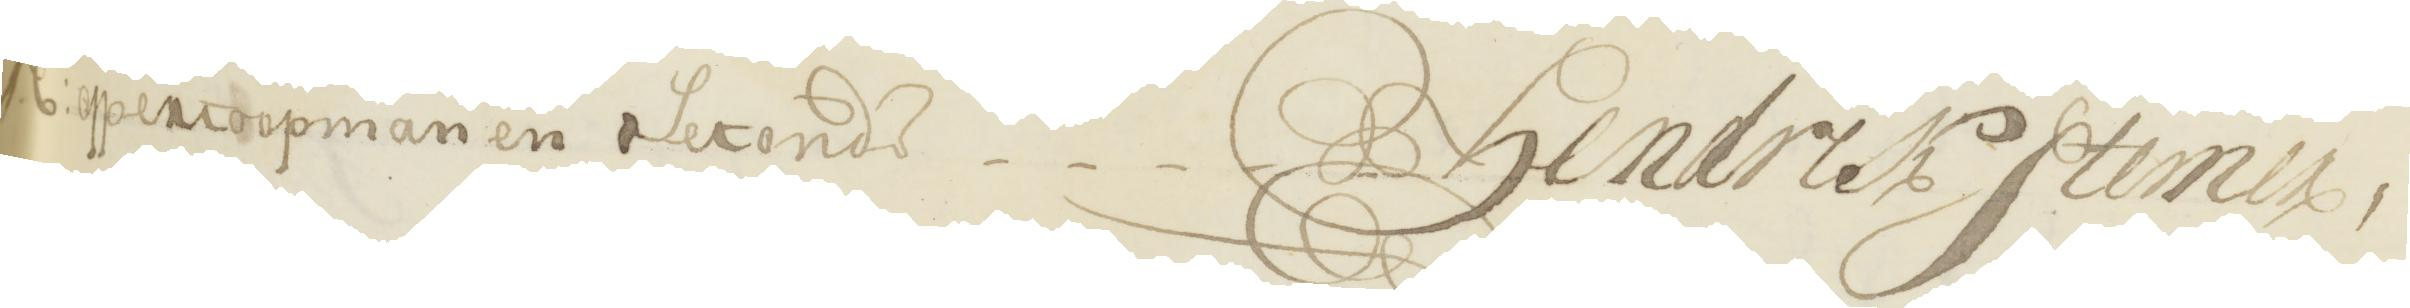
E: oppercoopman en Seconde - - - - - Hendrik Stemer,
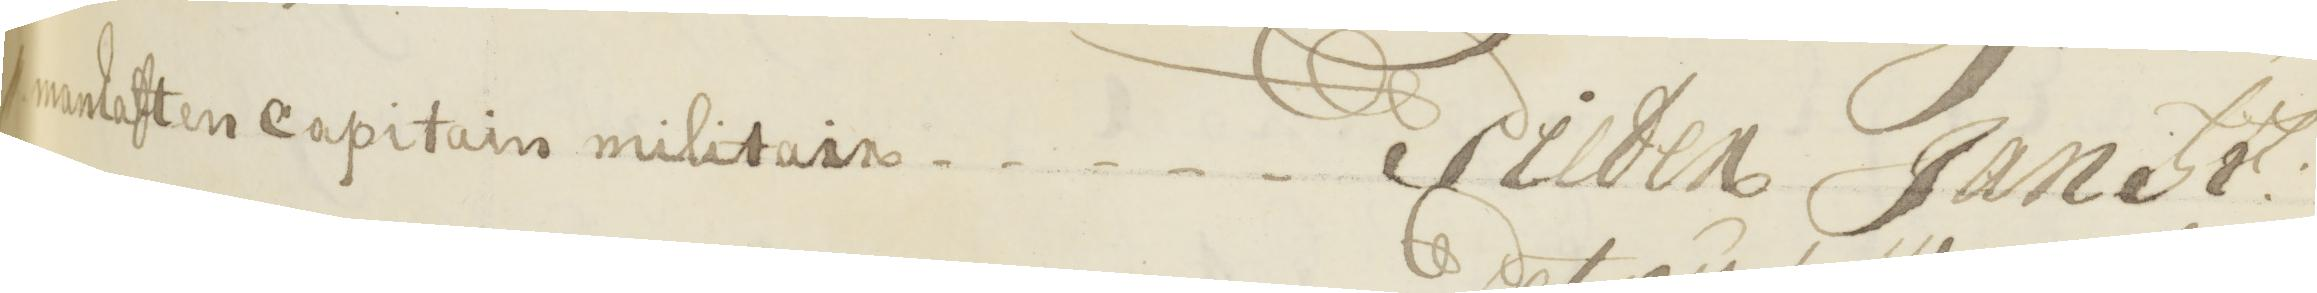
„ manhaften capitain militair - - - - - Pieter Jansz:
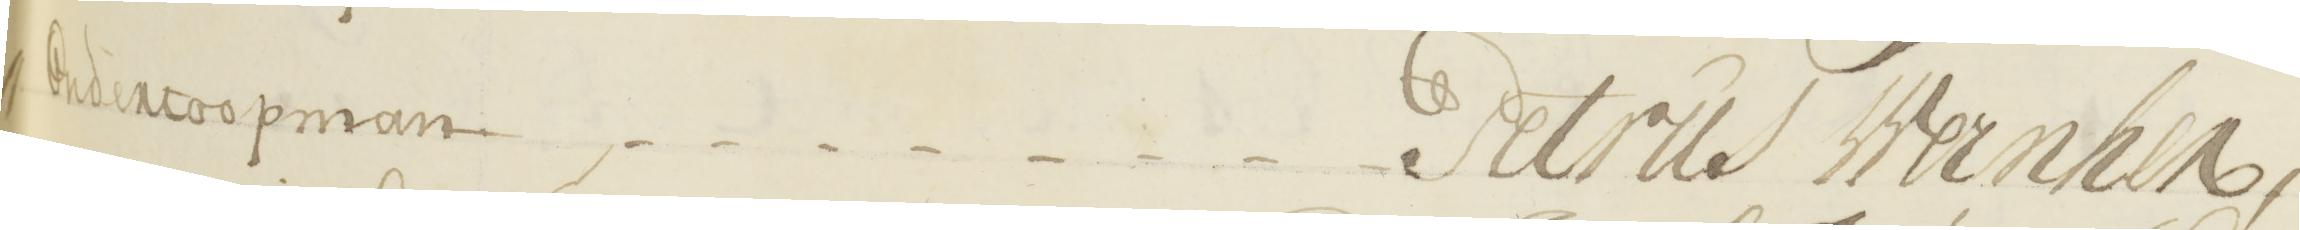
„ Ondercoopman - - - - - - - - Petrus Wernher,
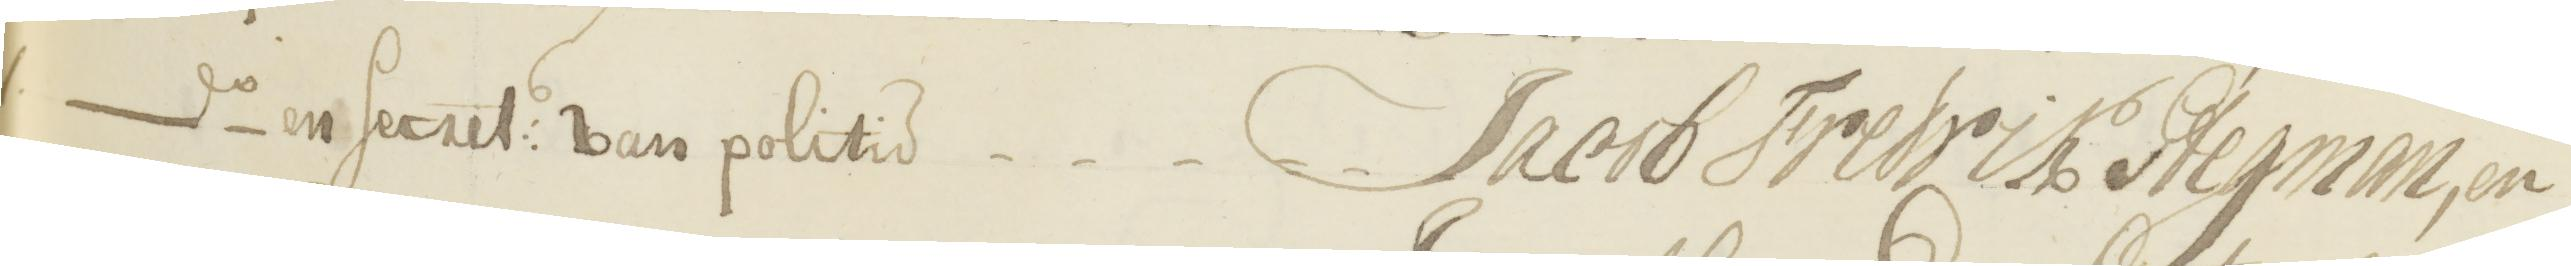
„ d_o en secret:s van politie - - - - - Iacob Fredrik Stegman, en
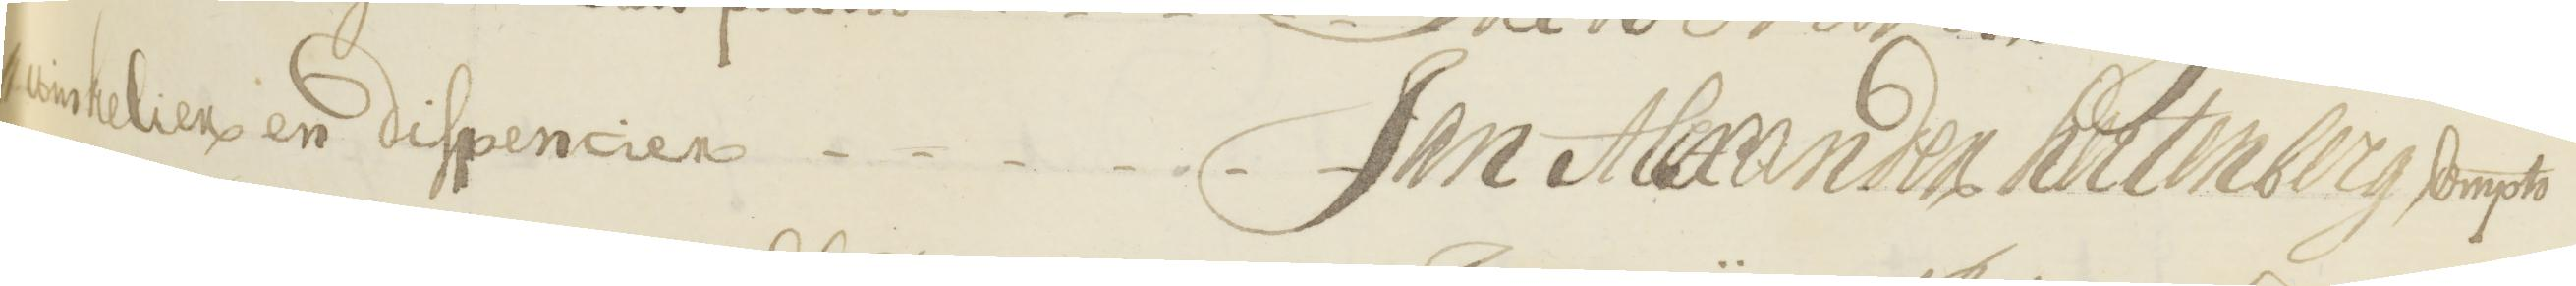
„ winkelier en dispencier - - - - - - - Jan Alexander hertenberg, Ompts
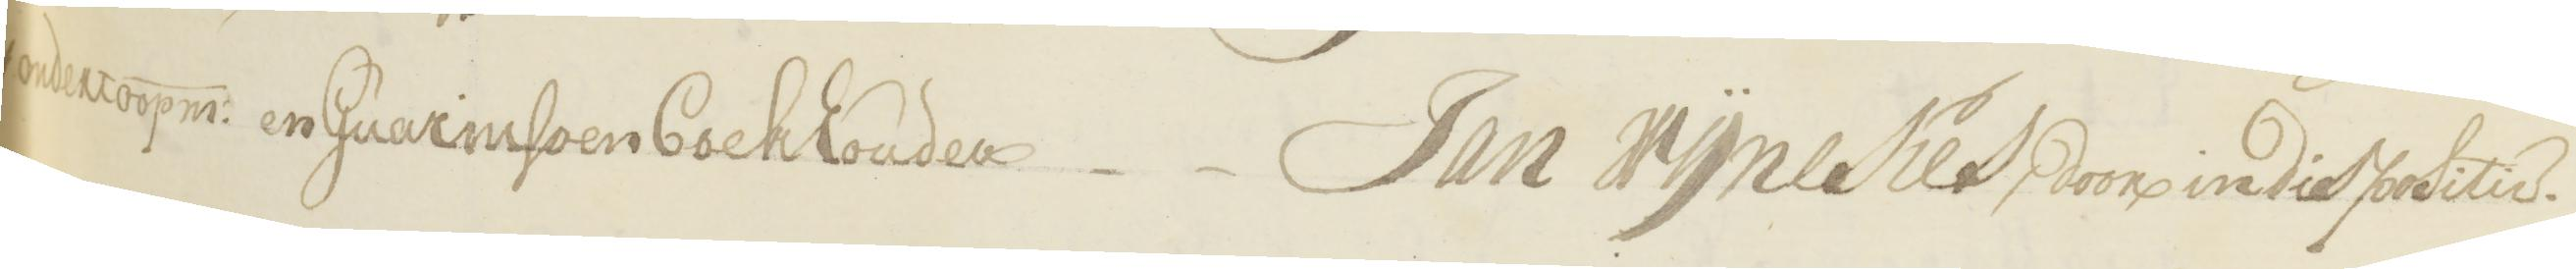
„ ondercoopm: en Guarinsoenboekhouder - - Ian Wijnekes, door indispositie.
